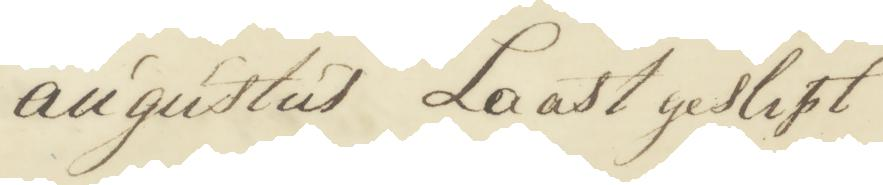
augustus Laast geslipt
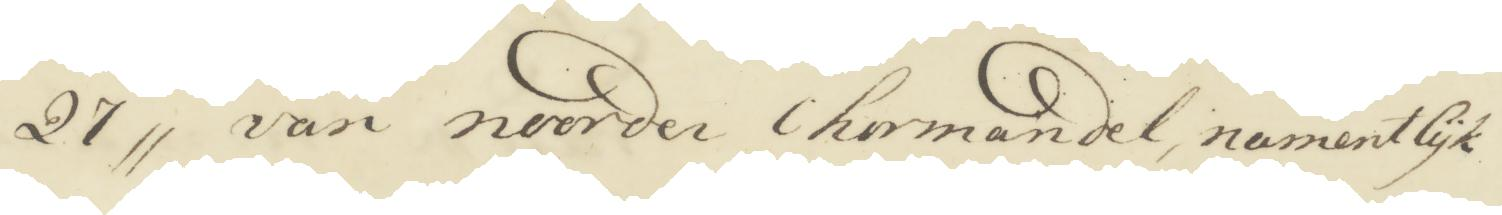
27 „ van noorder chormandel, namentlijk
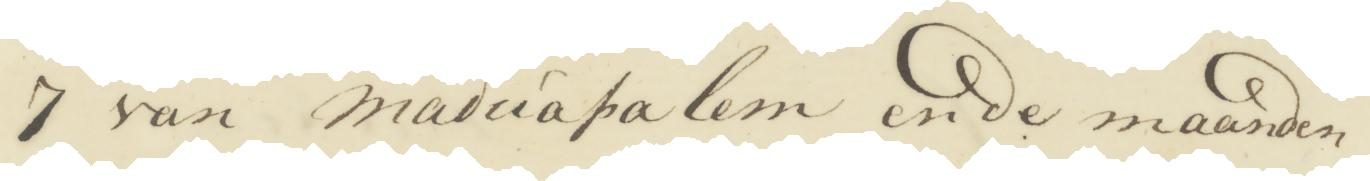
7 van maduapalem en de maanden
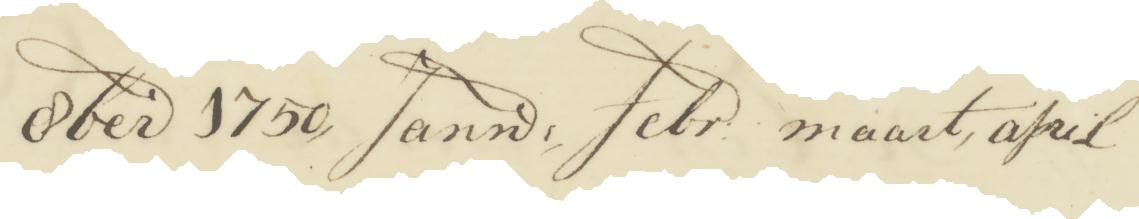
8ber 1750, Jann: febr: maart, april
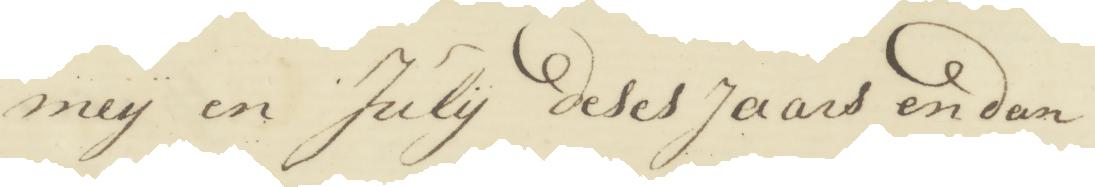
meij en Julij deses Jaars en dan
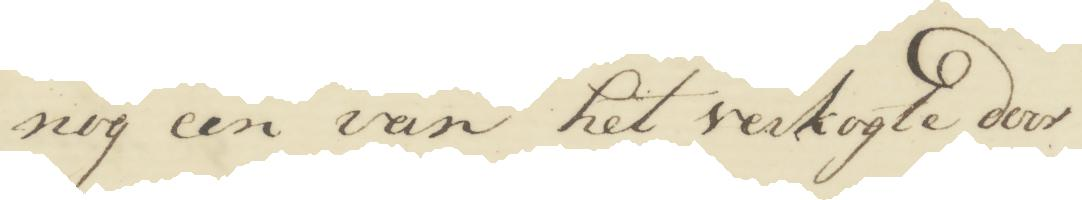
nog een van het verkogte door
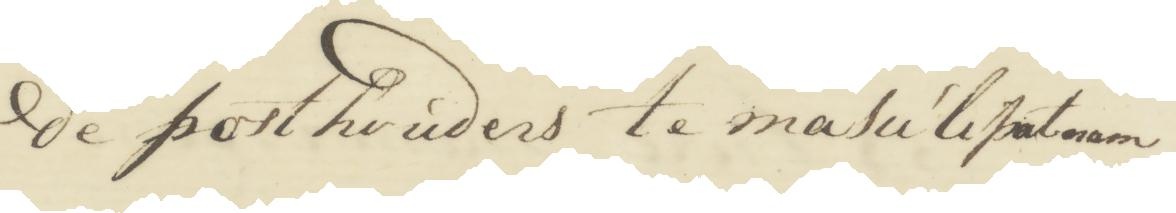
de posthouders te masulipatnam
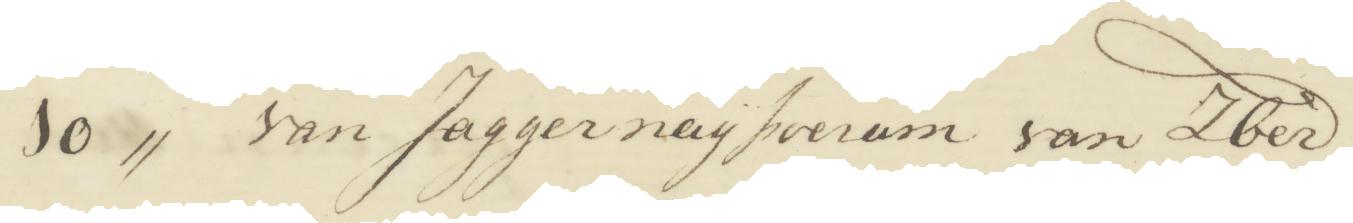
10 „ van Jaggernaij poeram van Zber
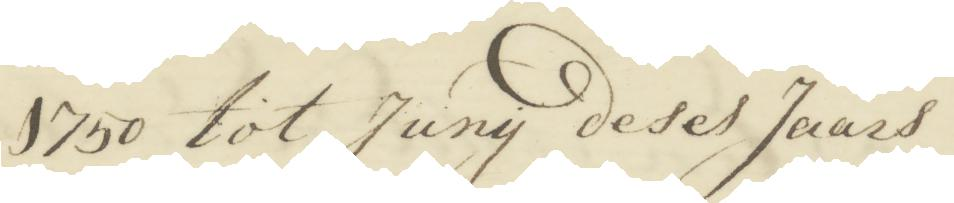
1750 tot Junij deses Jaars
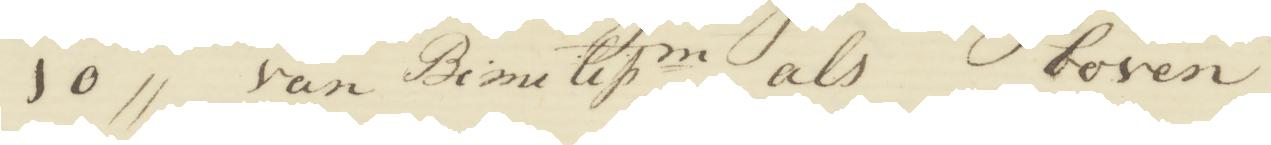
10 „ van Bimilip=m als boven
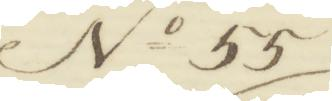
N=o 55
